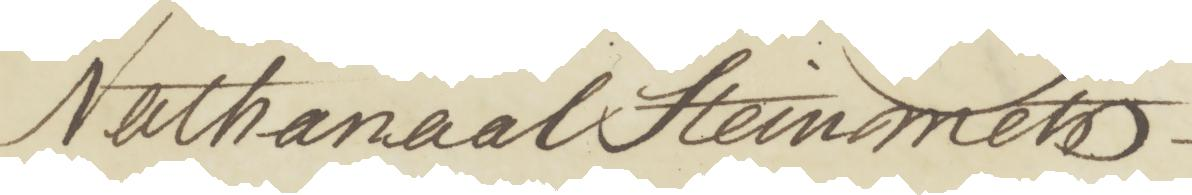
Nathanaal Steinmets —
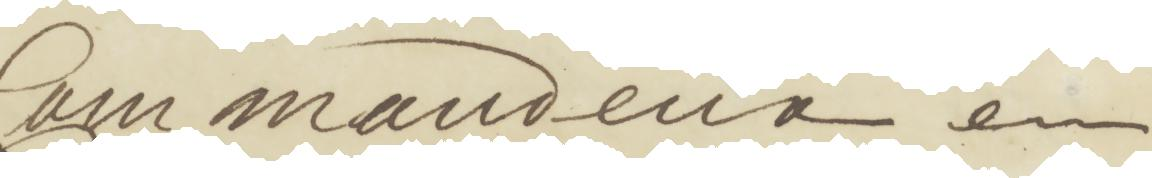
Commandeur en
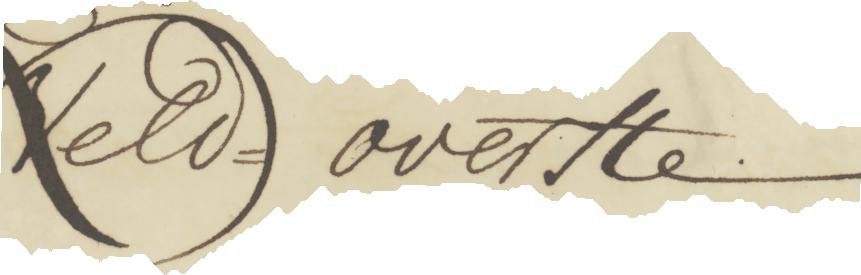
Veld= overste
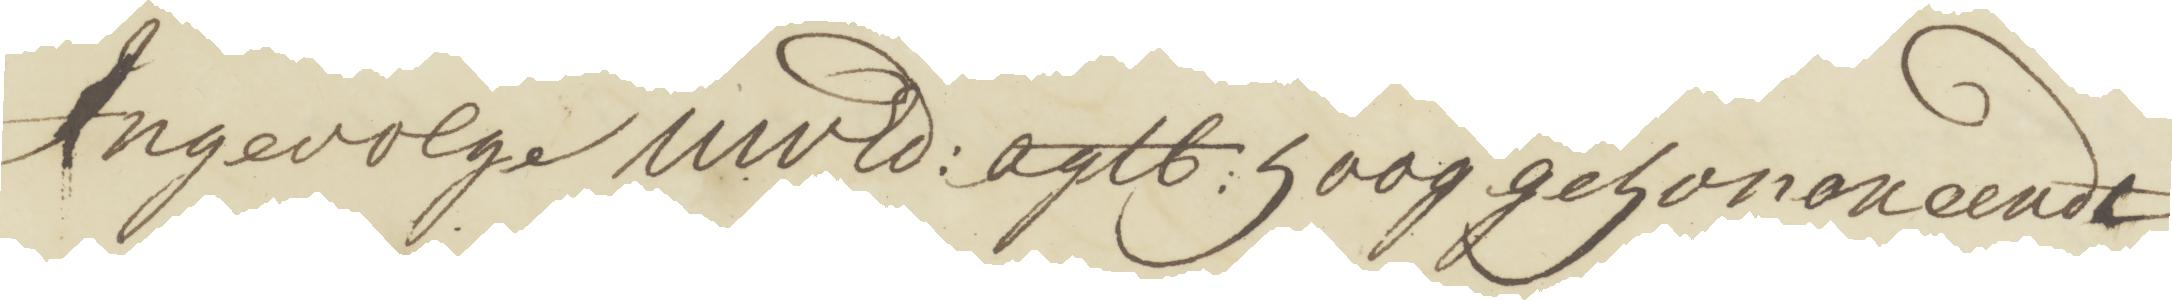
Ingevolge uw Ed: agtb: hoog gehonoreerdt
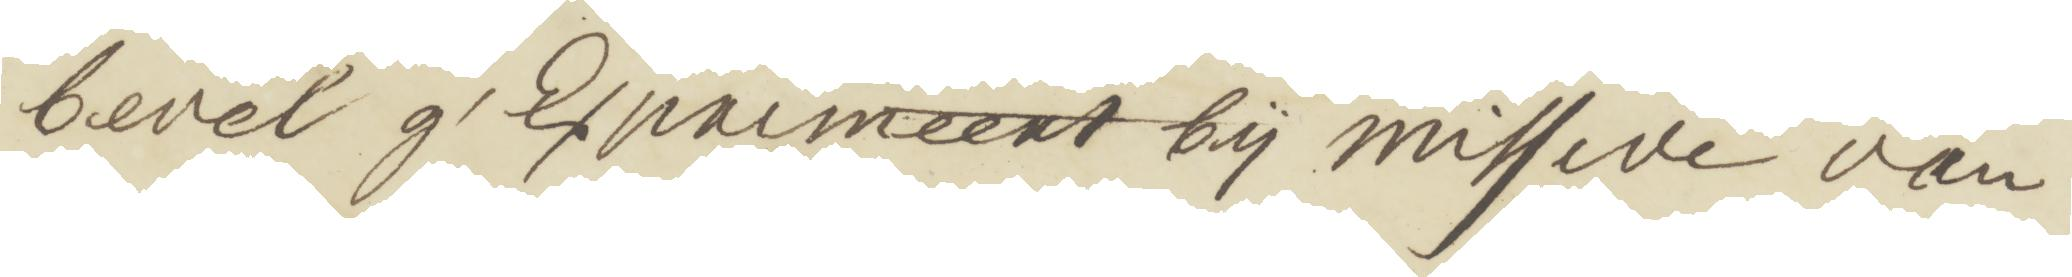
bevel g’ Exprimeert bij missive van
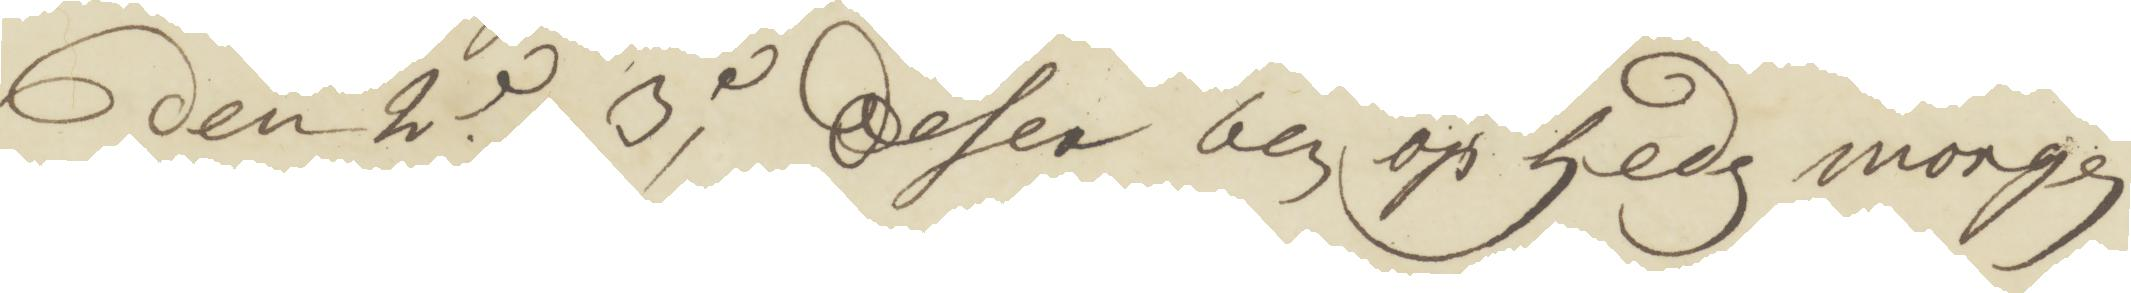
den 2.e en 3,e deser aen op heden morgen
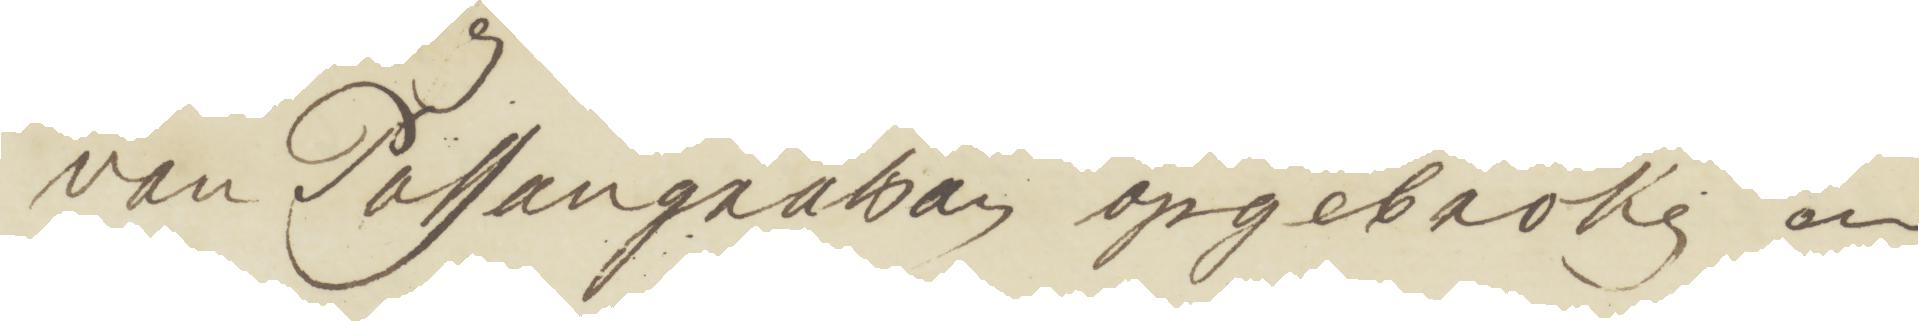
van Passangrahan opgebroken en
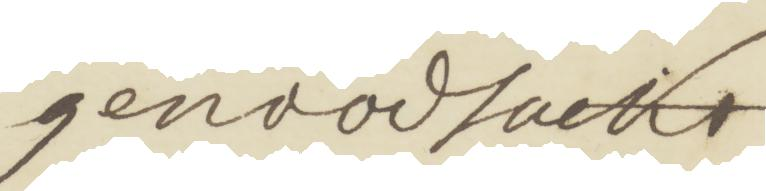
genoodsaekt
